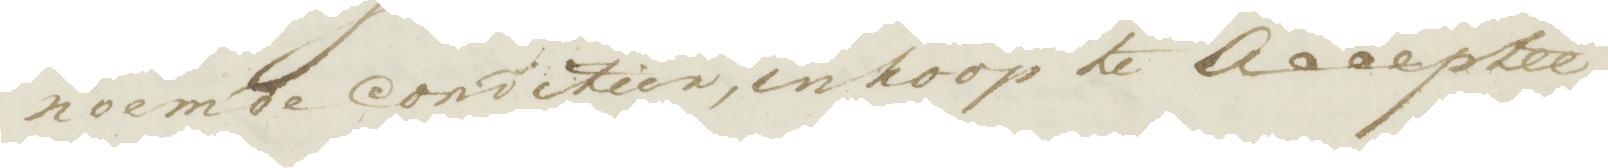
noemde conditien, in koop te acceptee‚
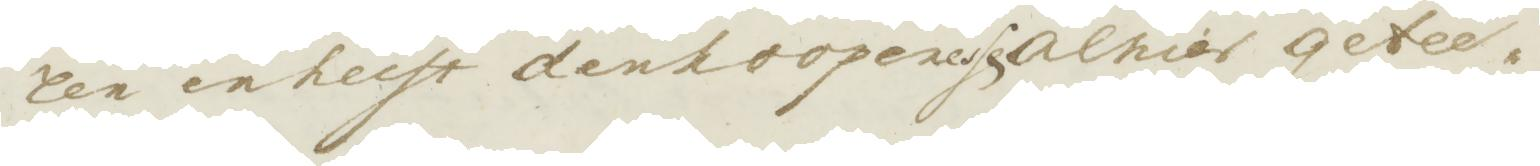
ren en heeft den kooperesse alhier getee„
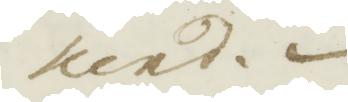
kend. –
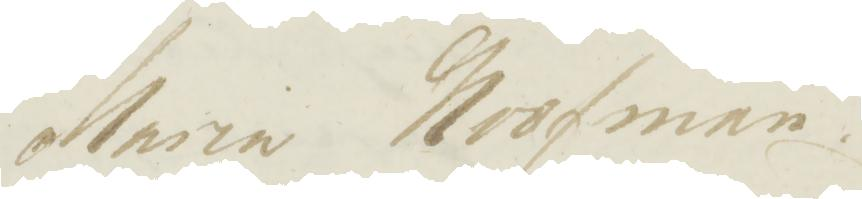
Maria Hoofman.
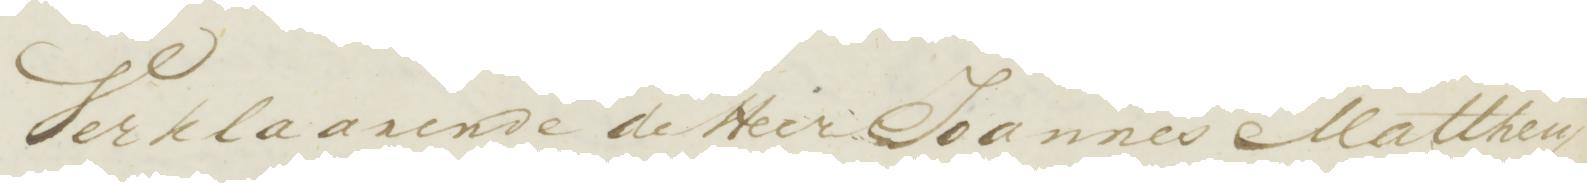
Verklaarende de Heer Joannes Mattheus
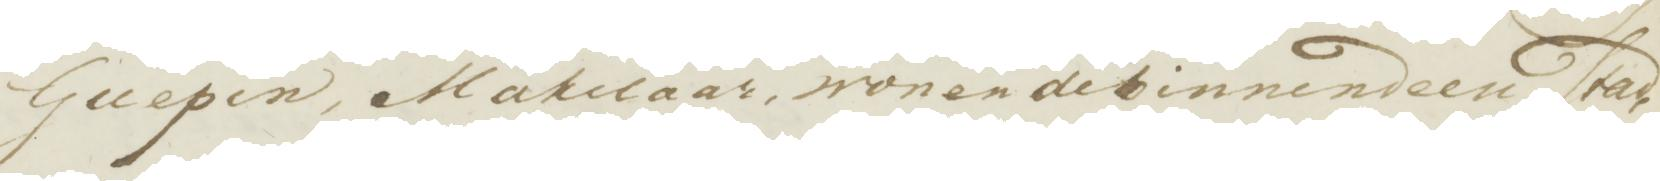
Guepin, Makelaar, wonende binnen deese stad
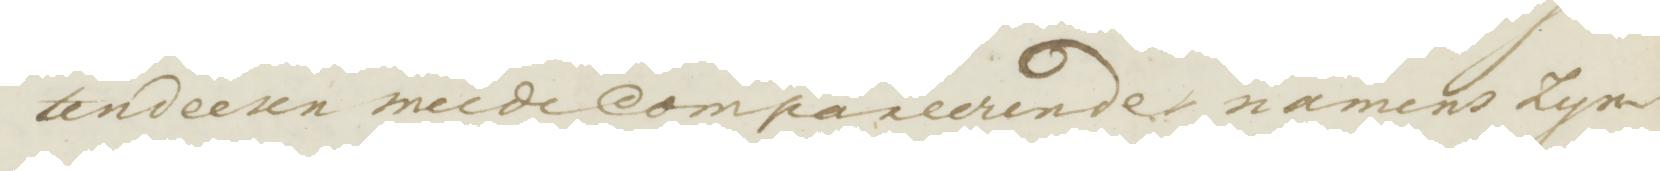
ten deesen meede compareerende namens zyn
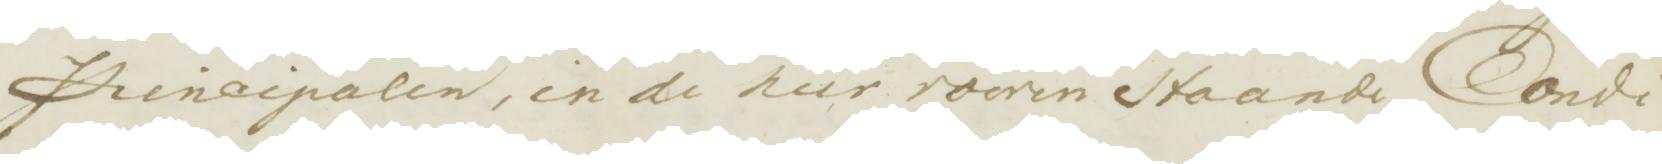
Principalen, in de hier voorenstaande Condi
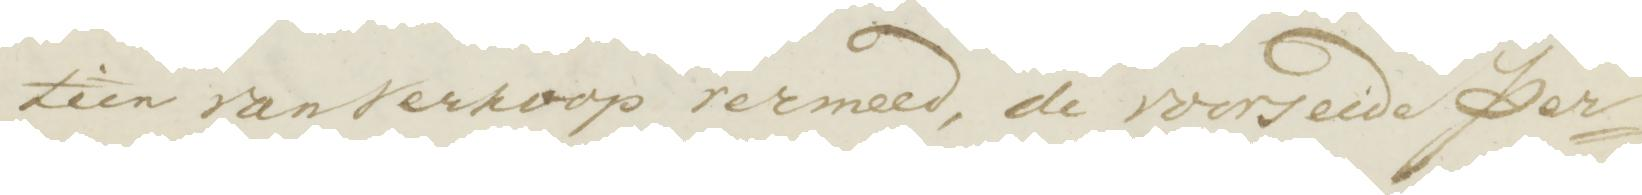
tien van verkoop vermeld, de voorseide per=
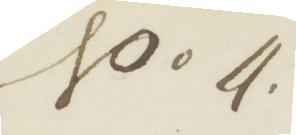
No 4.
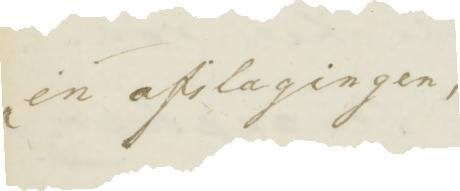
^ en afslagingen,
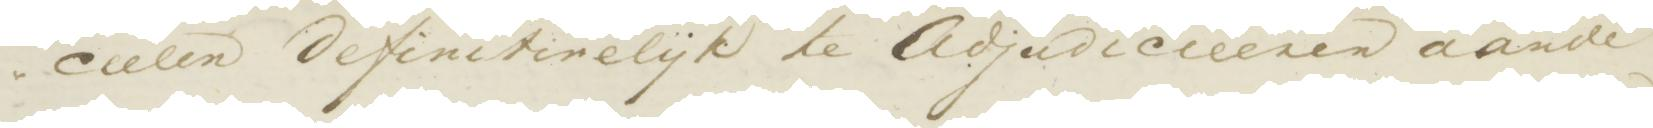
ceelen definitivelijk te Adjudicieeren aan de
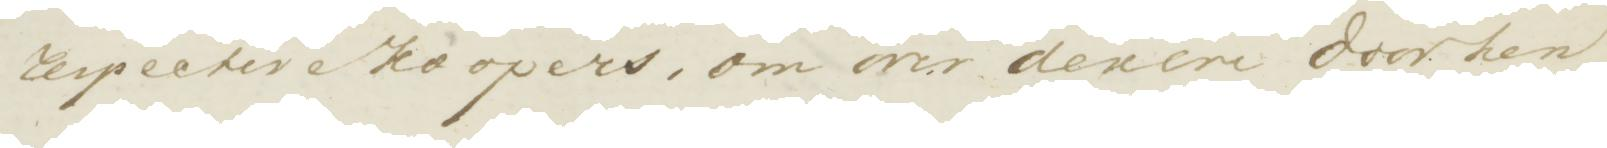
respective koopers, om over deselve door hen
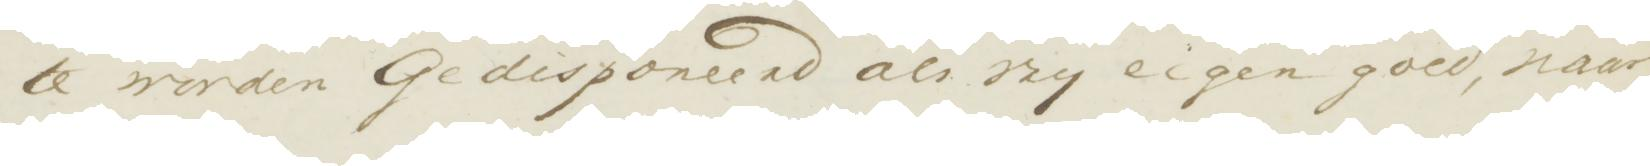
te worden gedisponeerd als vry eigen goed, naar
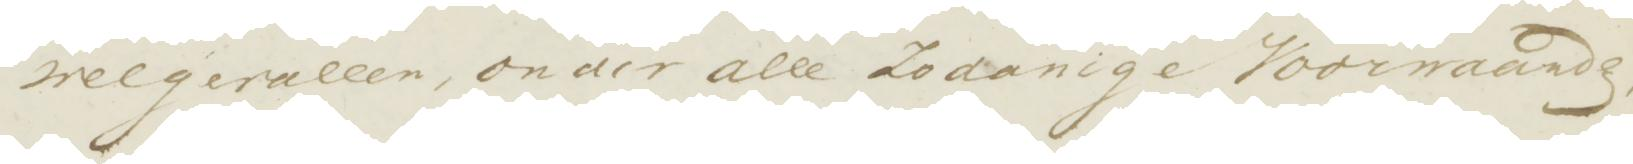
welgevallen, onder alle zodanige voorwaarden,
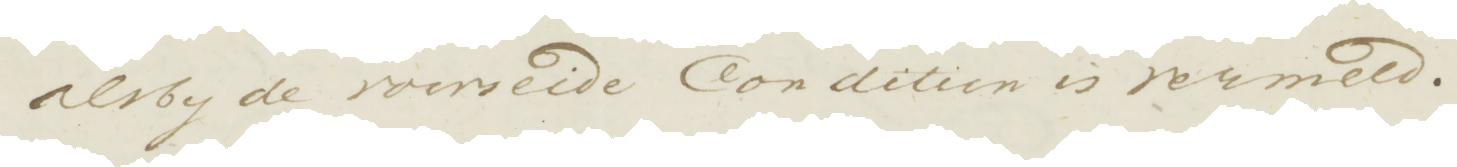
als by de voorseide condition is vermeld.
